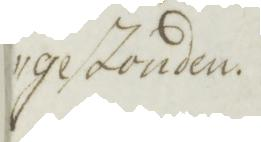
gezonden.
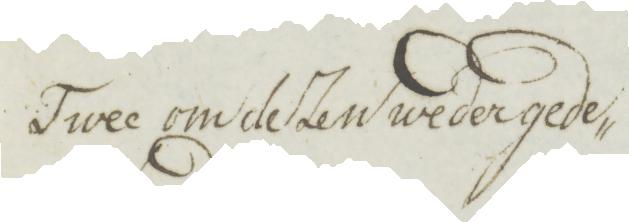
Twee om de zen weder gede„
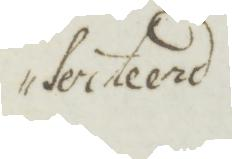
„serteerd
